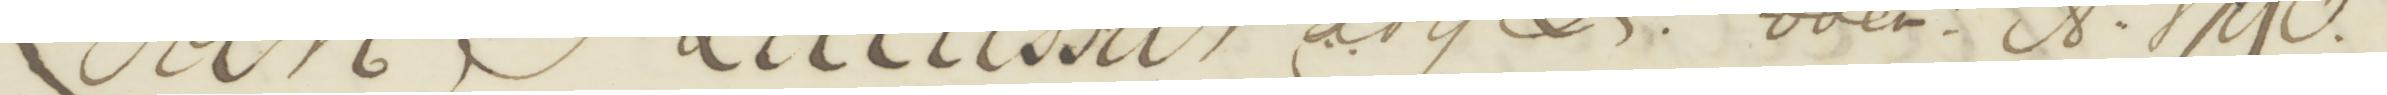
Van Macassar adij 25:' 8ber: A:o 1740.
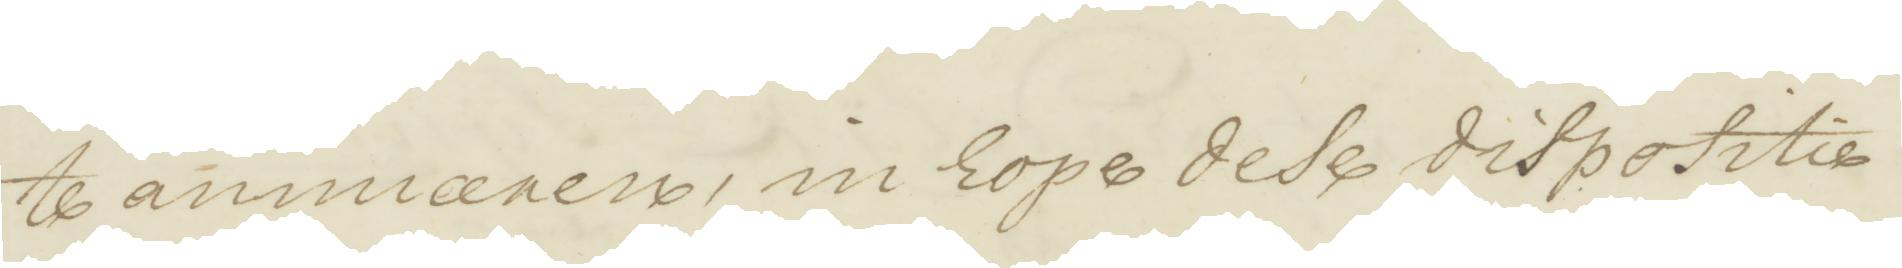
te animeeren, in hope dese dispositie
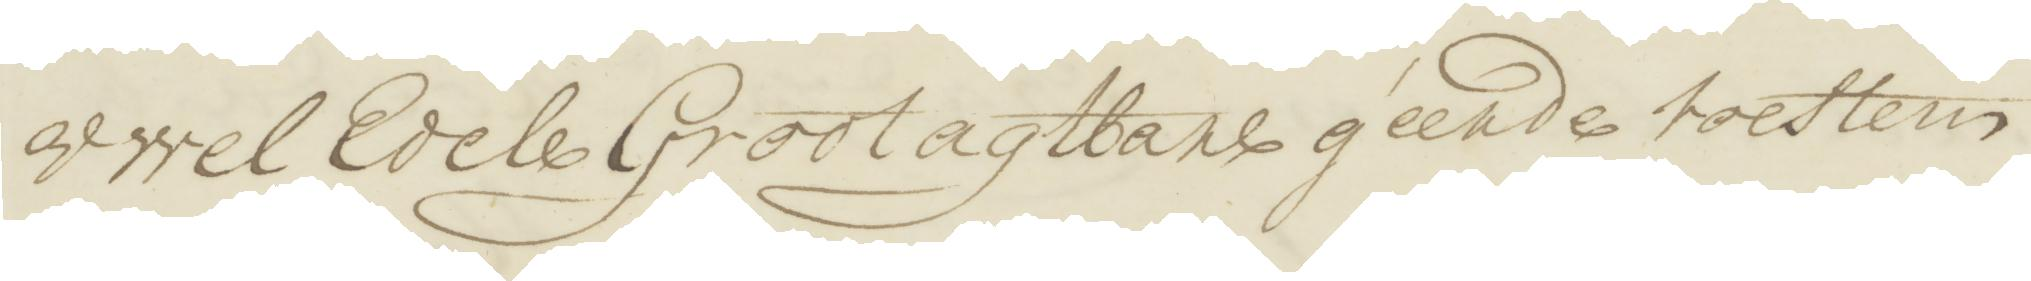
vwel Edele Groot agtbare g'eerde toestem
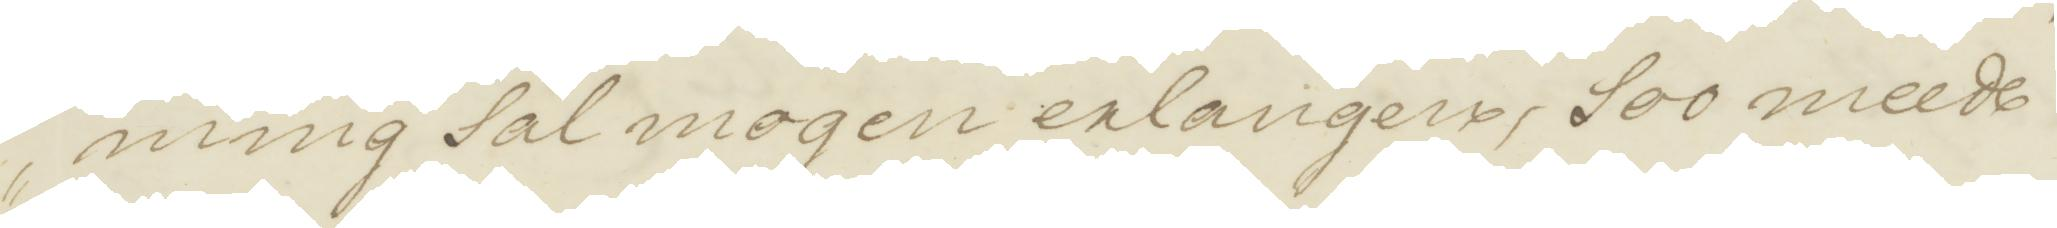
„ming sal mogen erlangen, soo meede
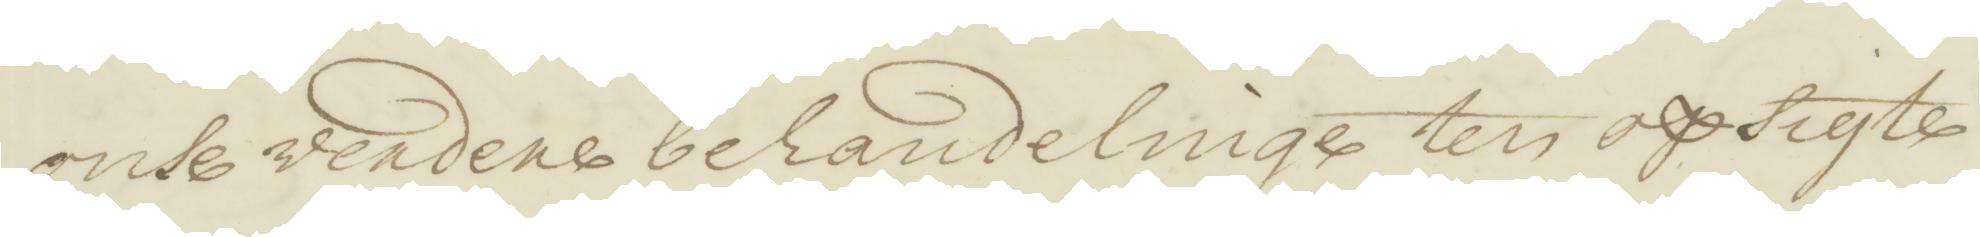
onse verdere behandelinge ten opsigte
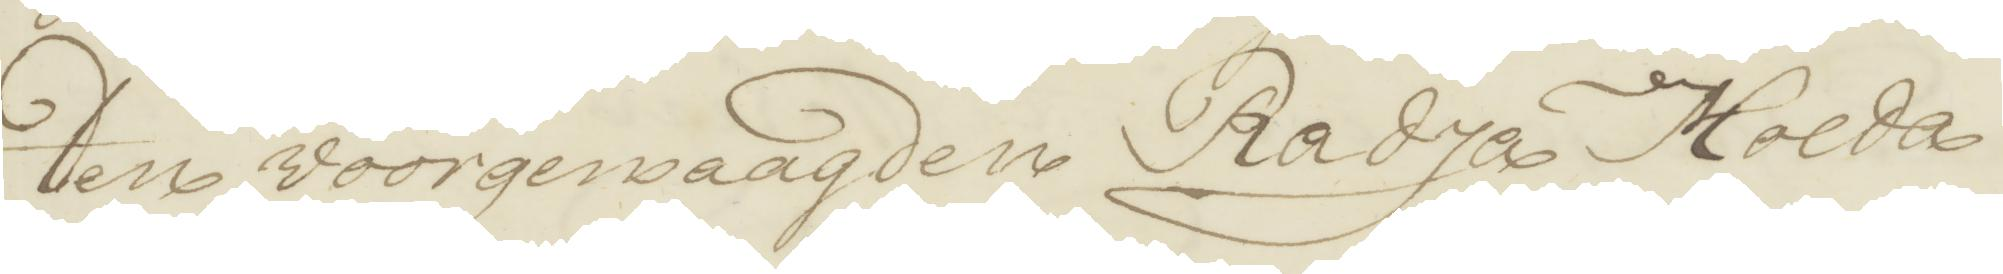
den voorgewaagden Radja Moeda
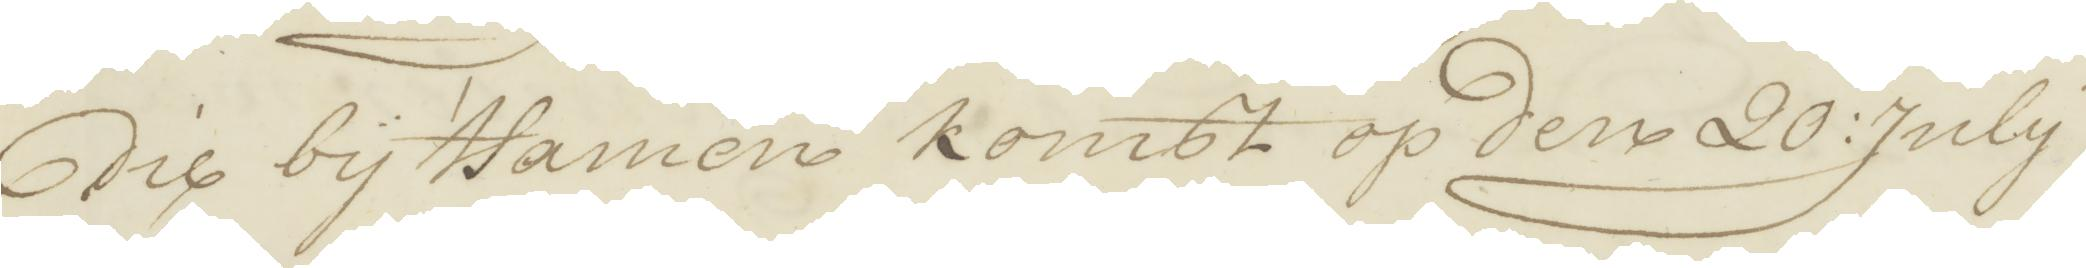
die bij 'tsamen komst op den 20:' Julij
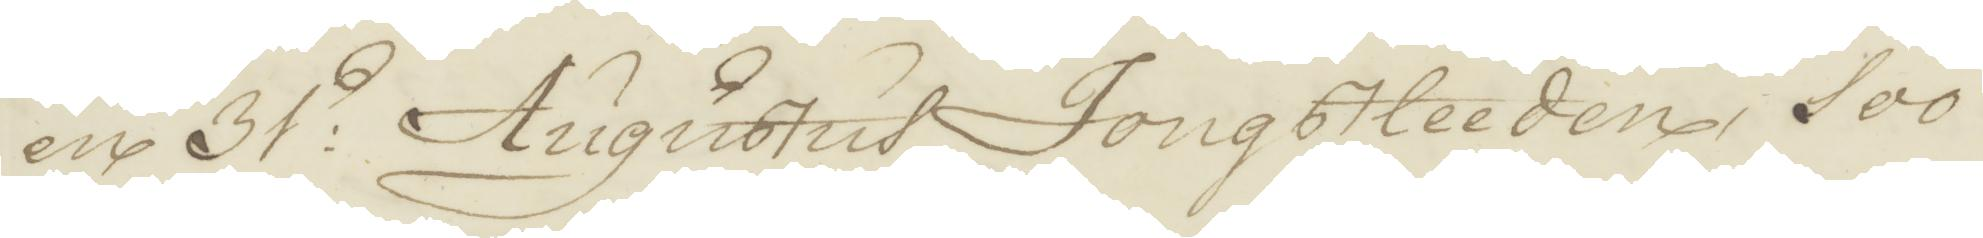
en 31:e Augustus Jongstleeden, soo
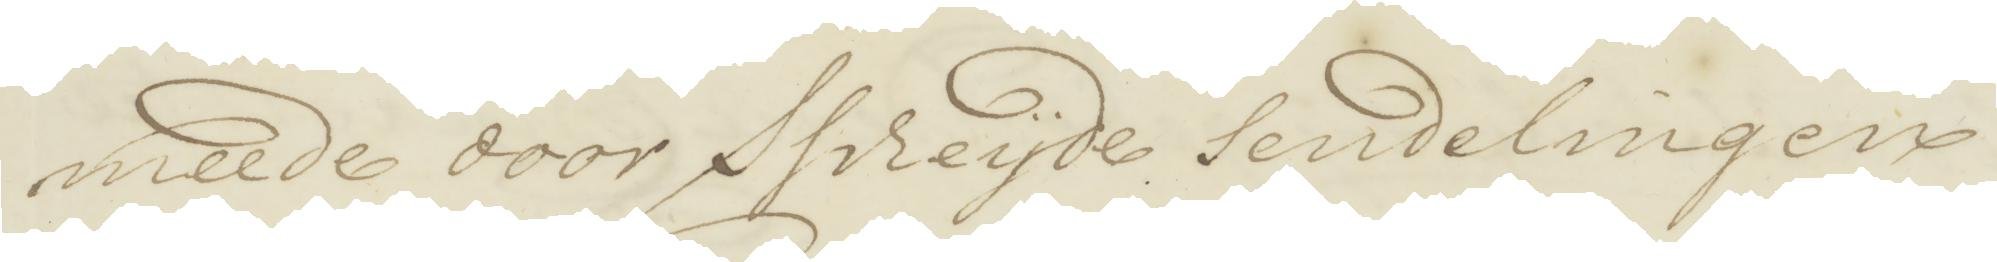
meede door verscheijde sendelingen
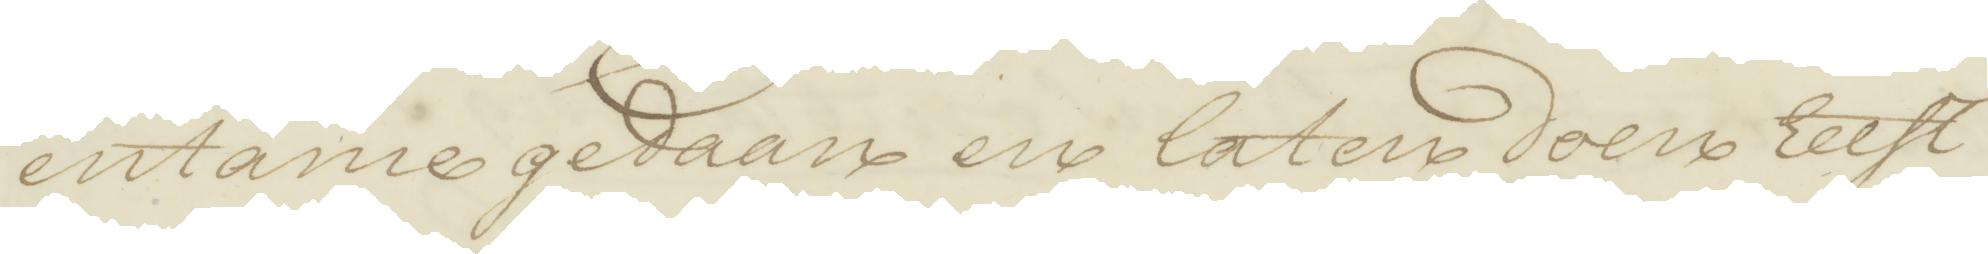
entanie gedaan en laten doen heeft
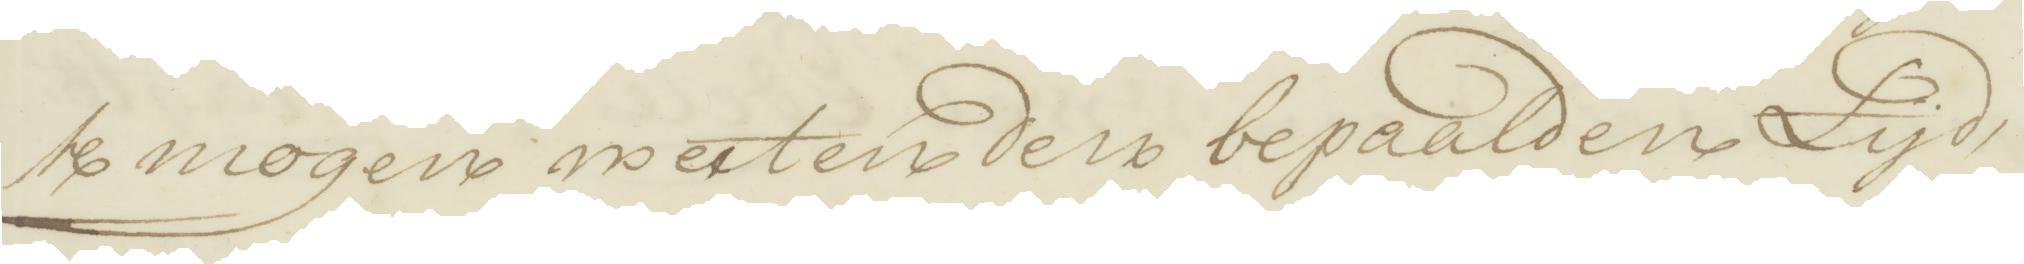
te mogen werten den bepaalden tijd,
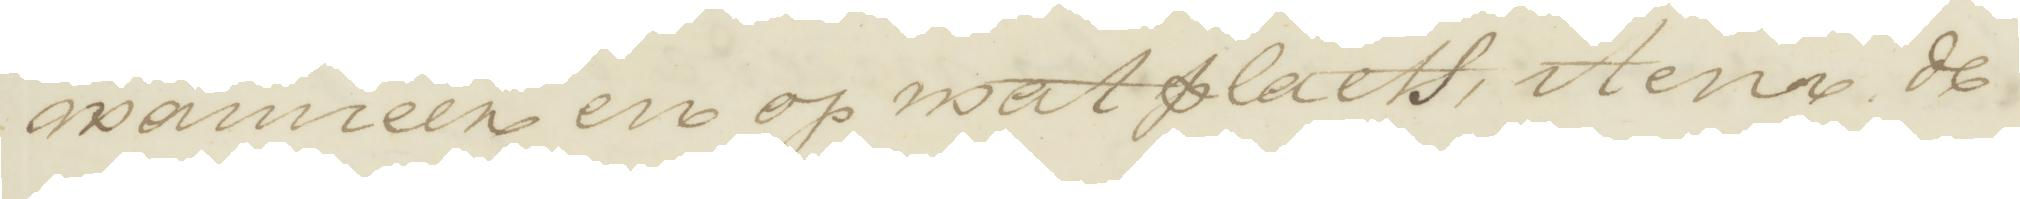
wanneer en op watplaets, item de
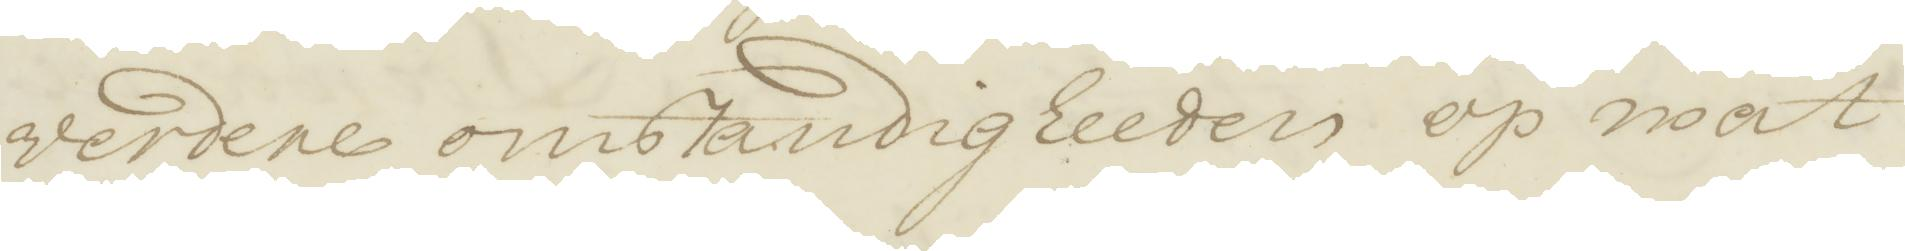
verdere omstandigheeden op wat
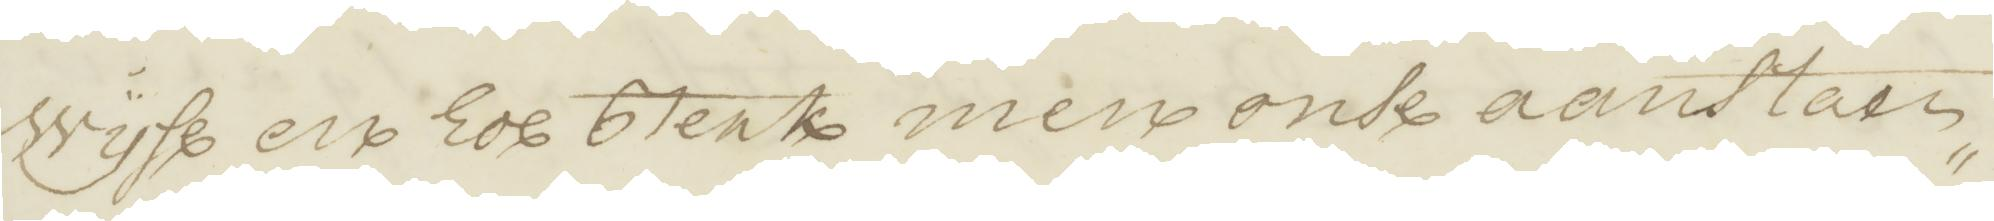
Wijse en hoe sterk men onse aanstaer„
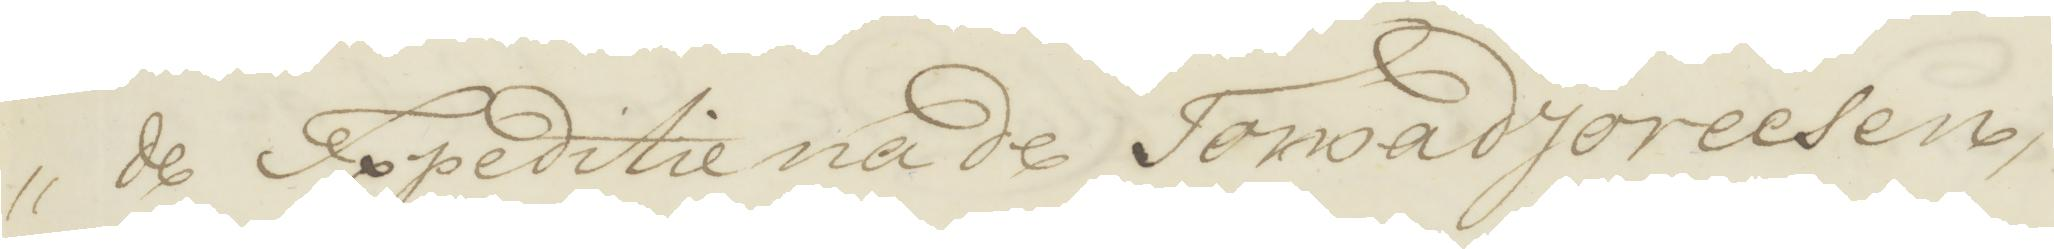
„de Expeditie na de Towadjoreesen,
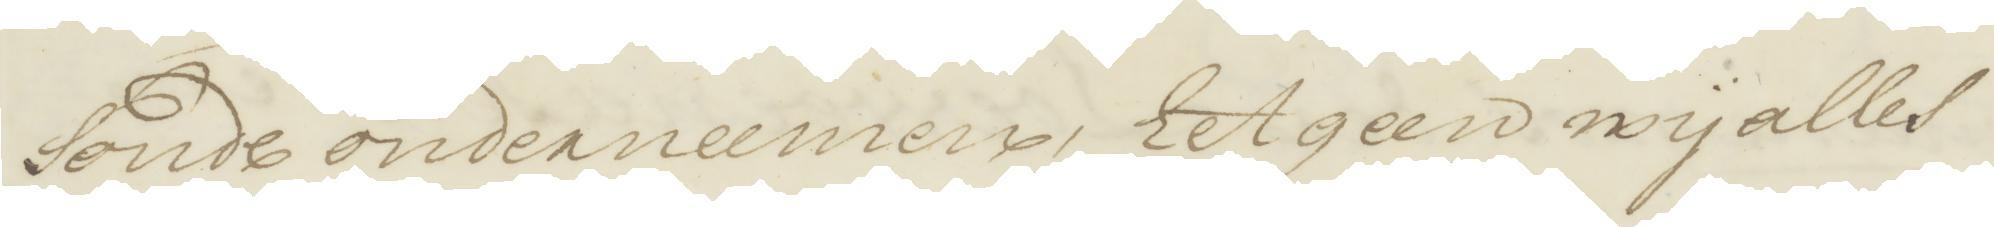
soude onderneemen, het geen wij alles
